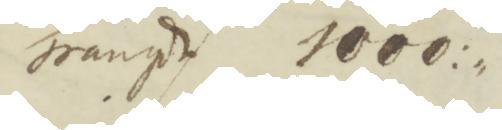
Transpt „ ƒ1000: „
